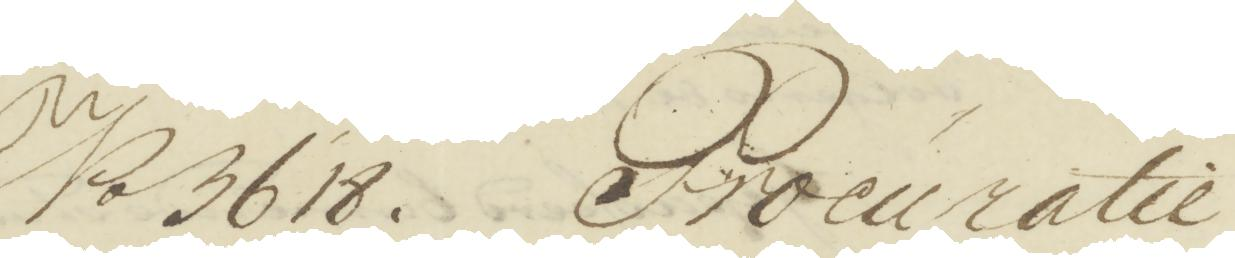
No 3618. Procuratie
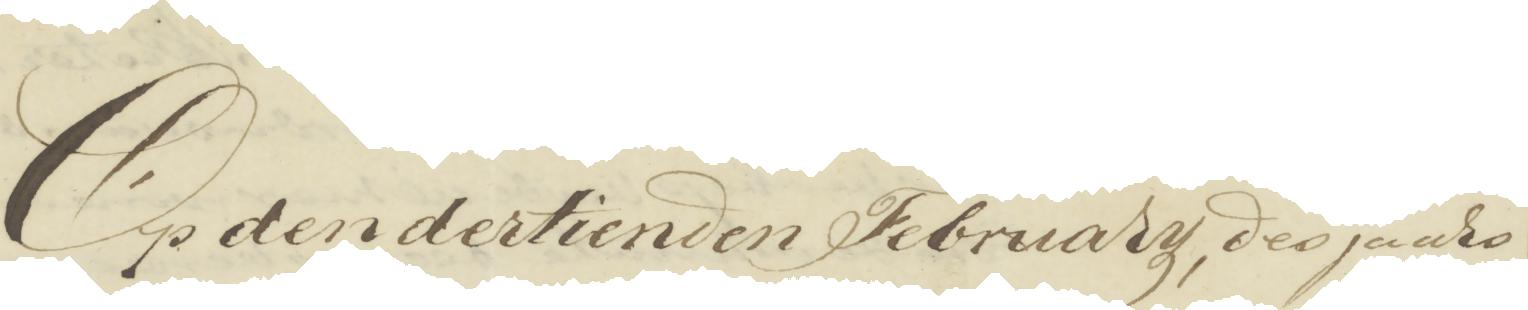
Op den dertienden February, des jaars
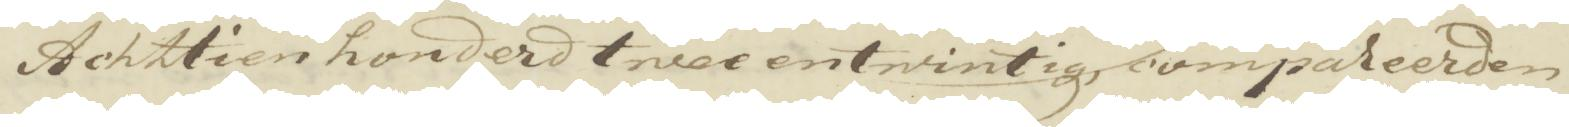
Achttien honderd twee entwintig, compareerden
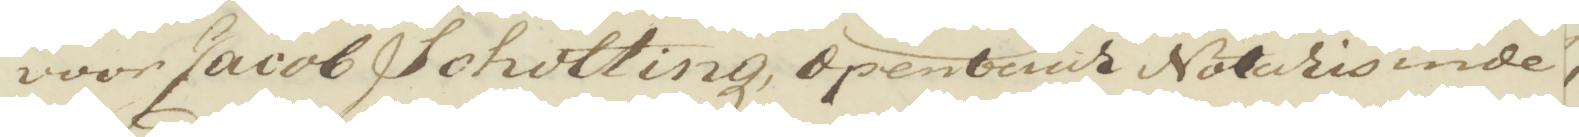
voor Jacob Scholting, Openbaar Notaris in de,
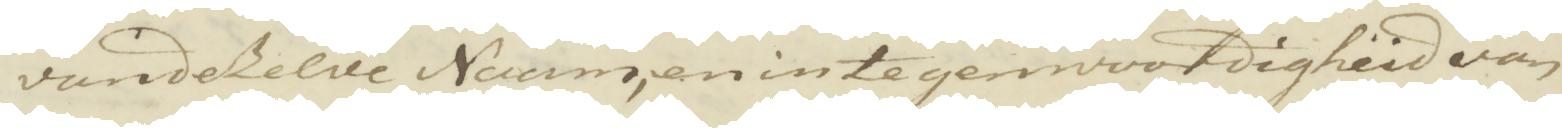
van dezelve Naam, en in tegenwoordigheid van
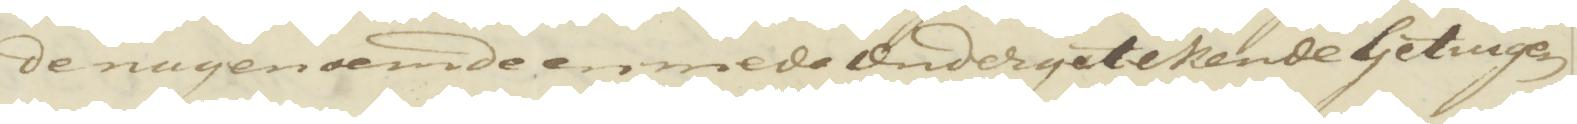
de nagenoemde en mede ondergetekende Getuigen
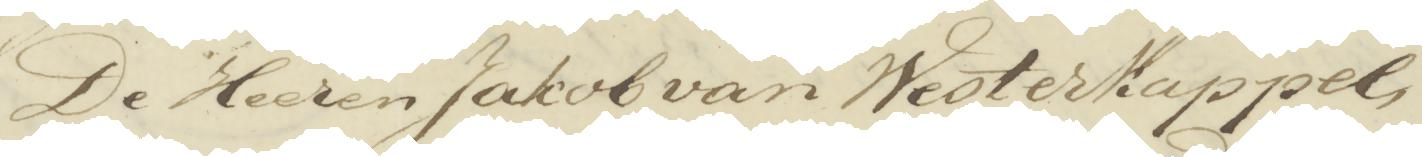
De Heeren Jakob van Westerkappel,
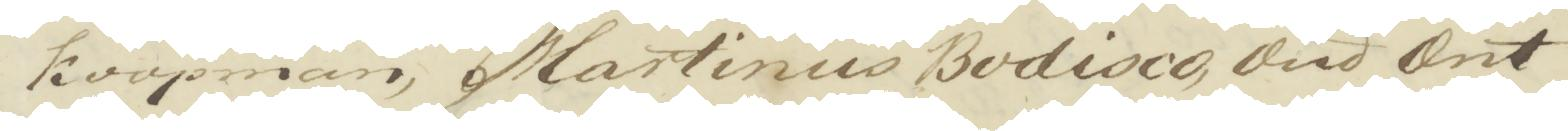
koopman, Martinus Bodisco, oud ont
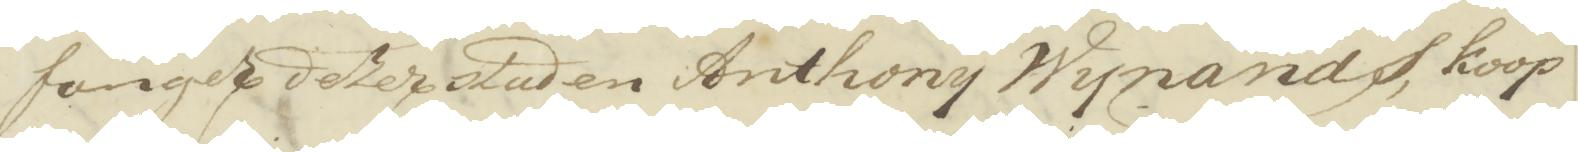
fanger dezer staden Anthony Wynands, koop
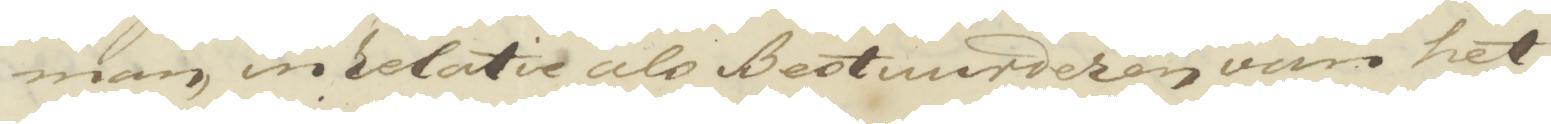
man, in relatie als Bestuurderen van het
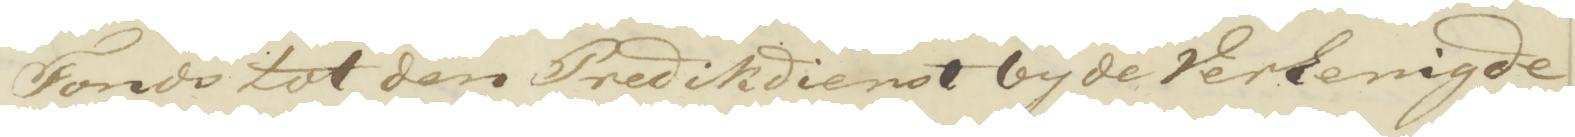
Fonds tot den Predikdienst by de VerEenigde
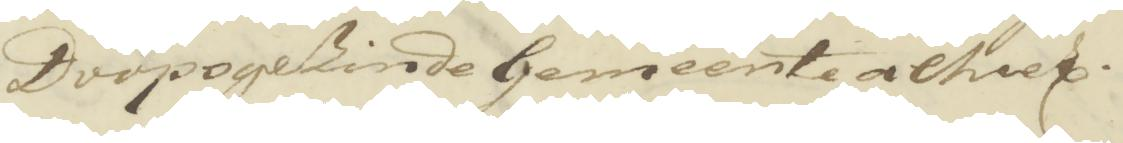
Doopsgezinde Gemeente alhier.
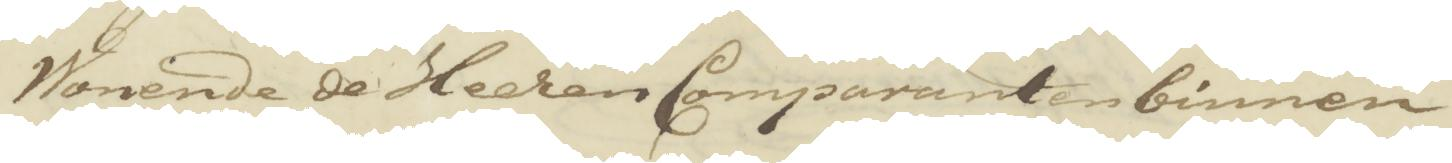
Wonende de Heeren Comparanten binnen
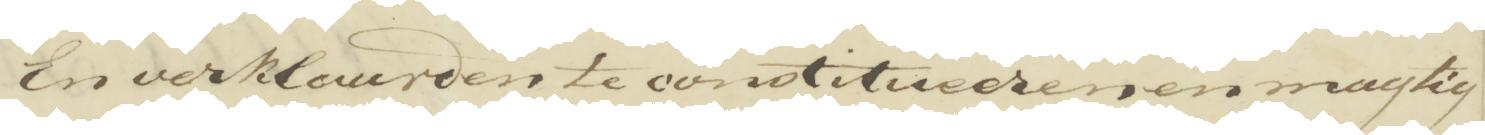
En verklaarden te constitueeren en magtig
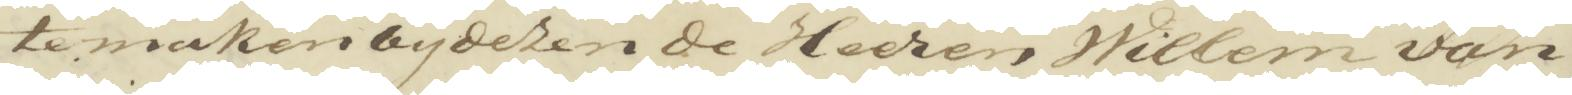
te maken bij dezen de Heeren Willem van
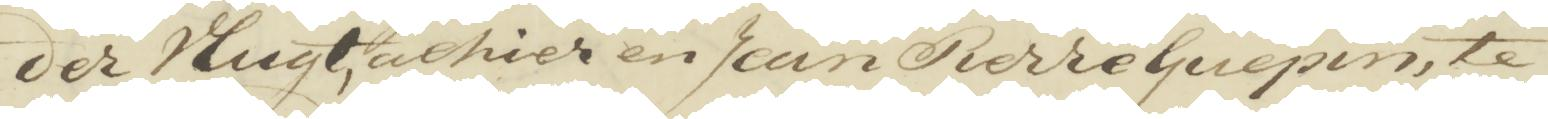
der Vlugt, alhier en Jean Pierre Guepin, te
